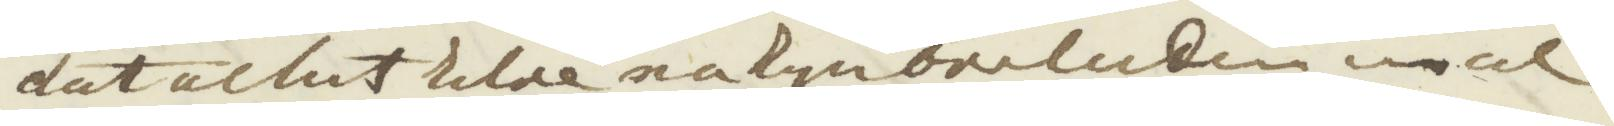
dat al het zelve na Zyn overleiden in al
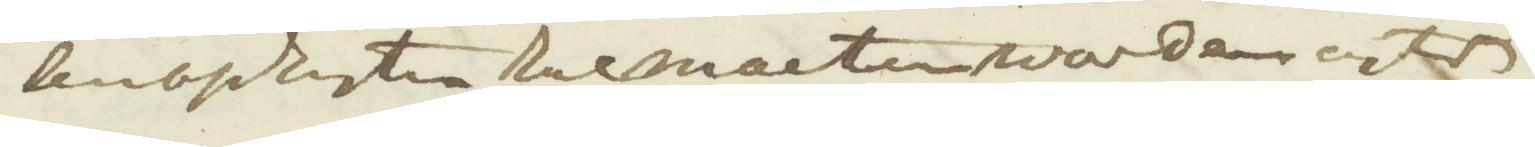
len opzigten Zal moeten worden agter
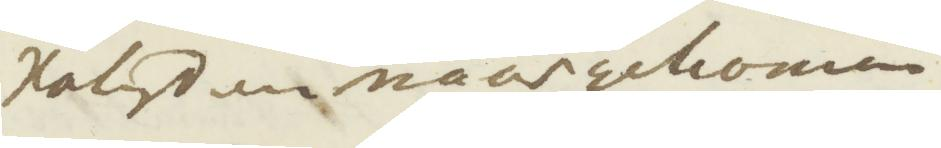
volgd en naar gekomen.
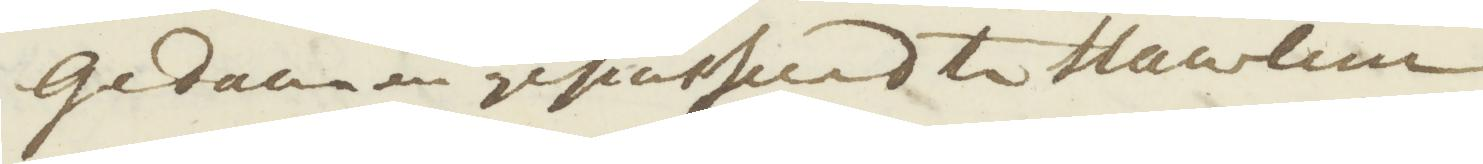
Gedaan en gepasseerd te Haarlem
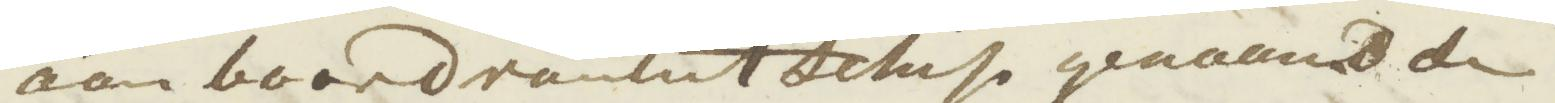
aan boord van het Schip genaamd de
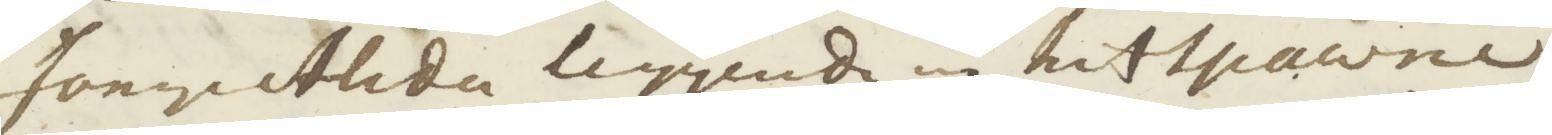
Jonge Alida liggende in het Spaarne
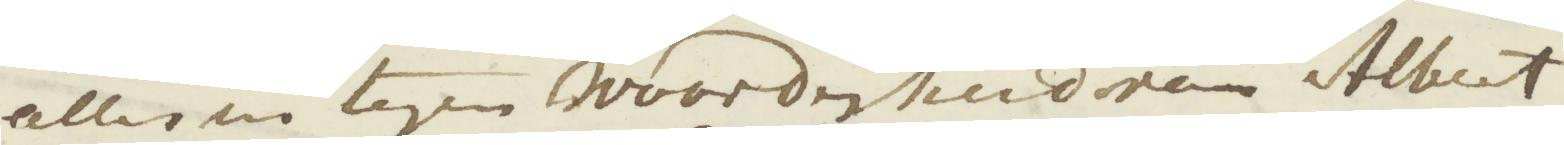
alles in tegenwoordigheid van Albert
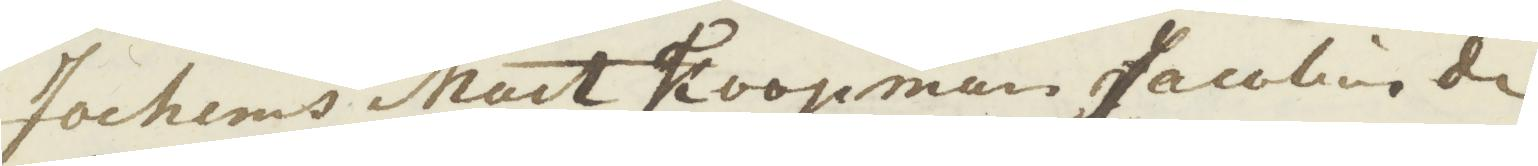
Jochems Mast Koopman Jacobus de
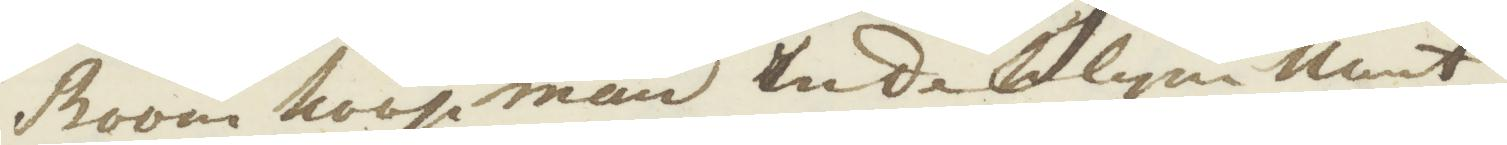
Boom koopman In de klyne Hout
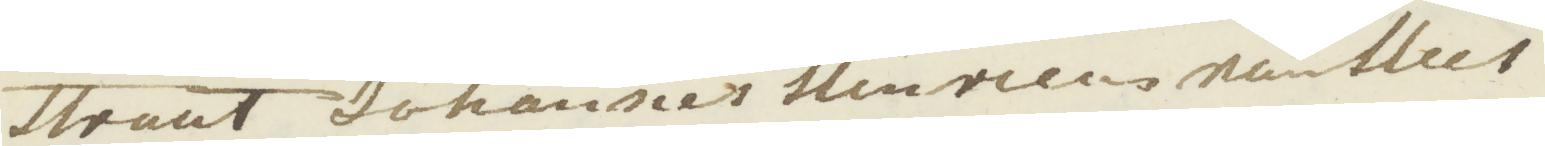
straat Johannes Henricus van Hees
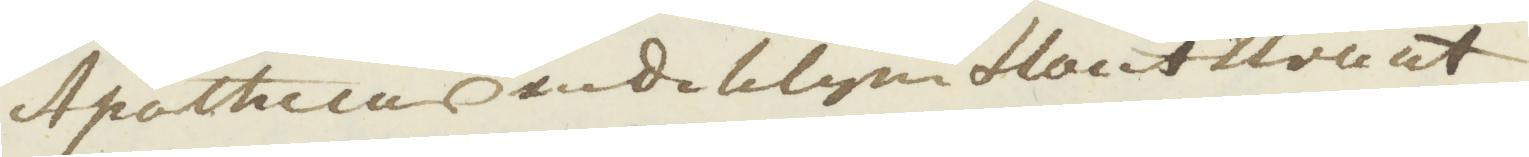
Apothecar in de klyne Houtstraat
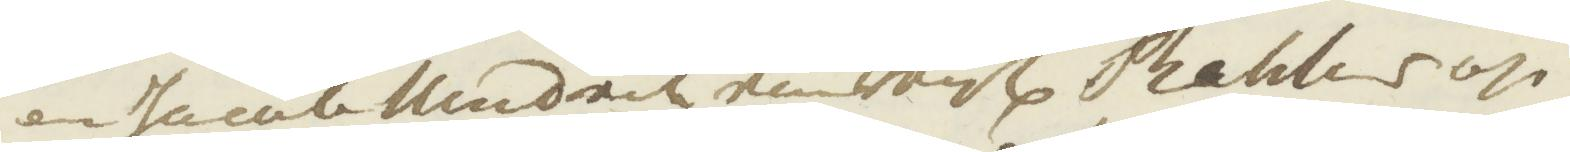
en Jacob Hendrik van Wyk Bakker op
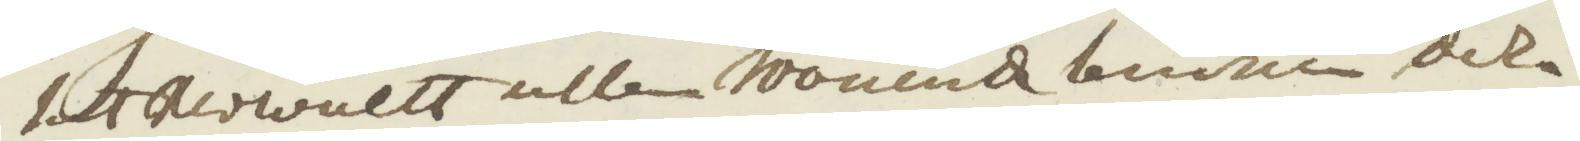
het Verwulft allen Wonend binnen deze
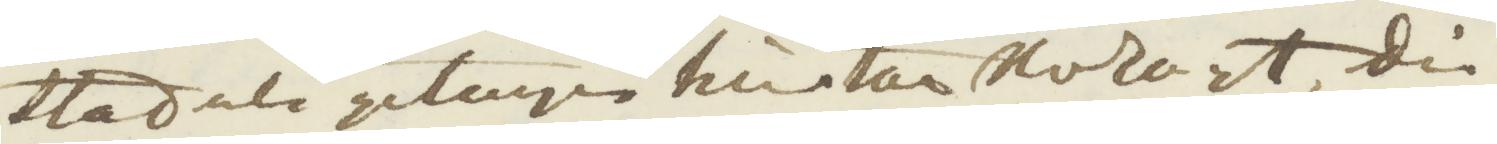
Stad als getuigen hier toe Verzogt, die
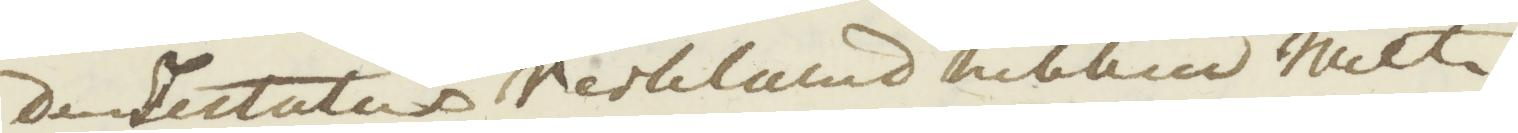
den Testateur, Verklaard hebben Wel te
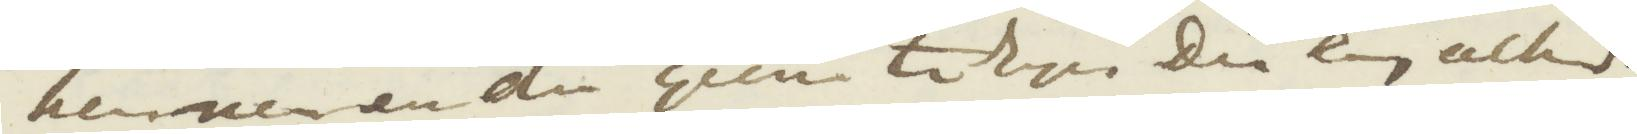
kennen en die geene te Zyn die hij alhier
